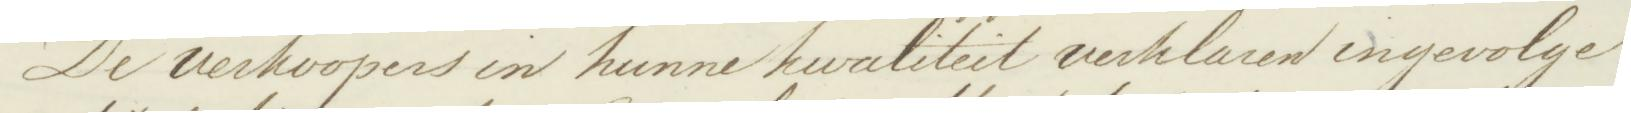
De verkoopers in hunne kwaliteit verklaren ingevolge
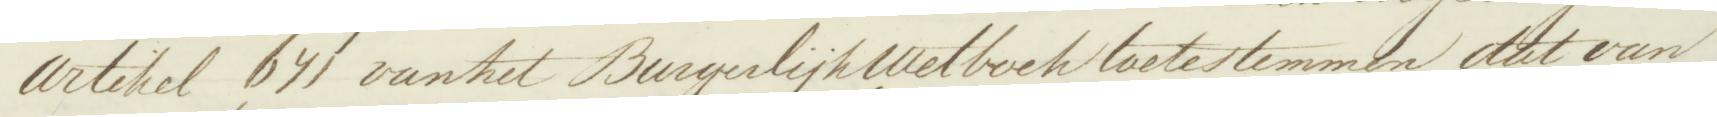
Artikel 671 van het Burgerlijk Wetboek toetestemmen dat van
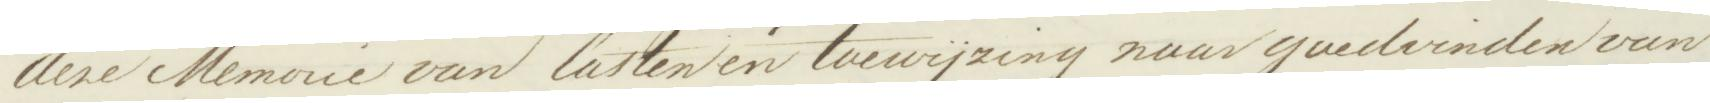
deze Memorie van lasten en toewijzing naar goedvinden van
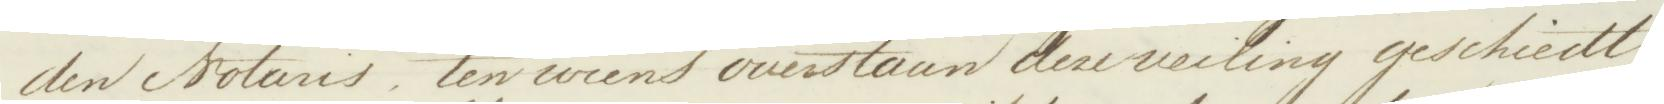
den Notaris, ten wiens overstaan deze veiling geschiedt,
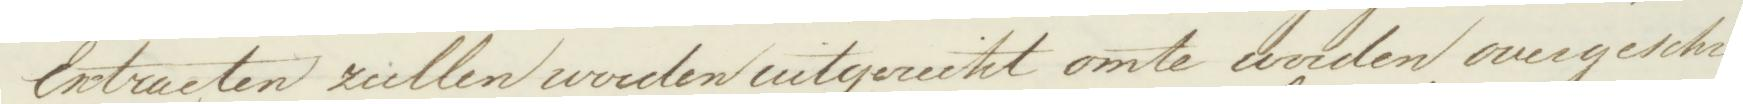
Extracten zullen worden uitgericht omte worden overgeschre
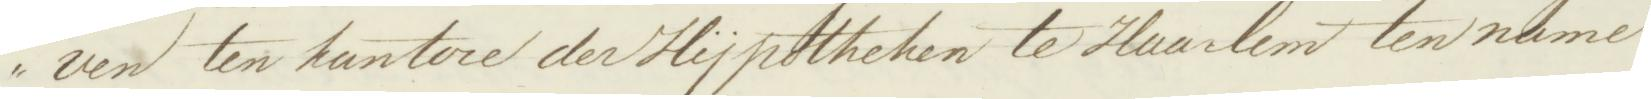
„ ven ten kantore der Hijpotheken te Haarlem ten name
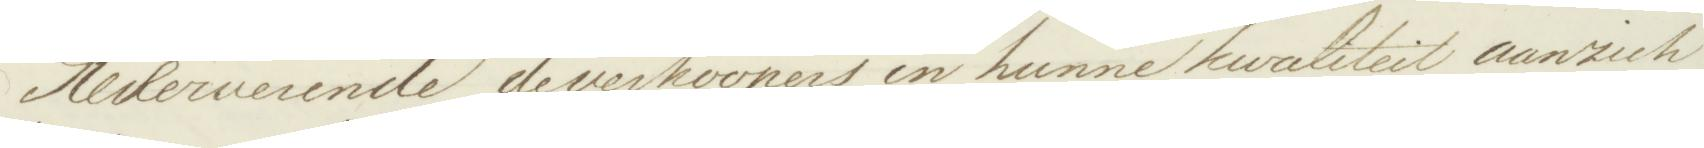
Reserverende deverkoopers in hunne kwaliteit aanzich
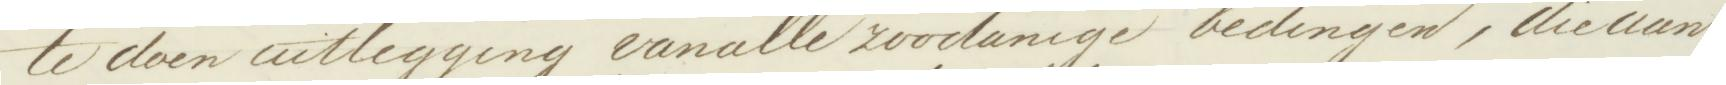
te doen uitlegging van alle zoodanige bedingen, die aan
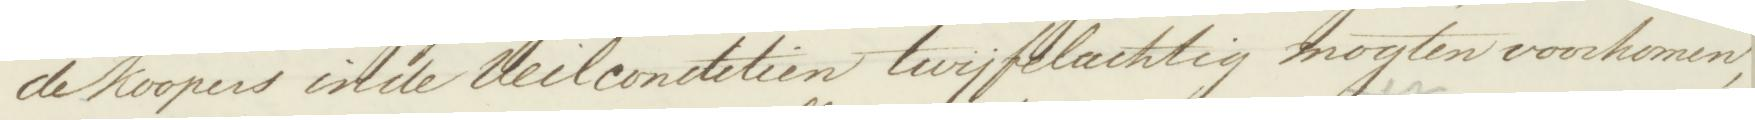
de koopers in de Veilconditien twijfelachtig mogten voorkomen,
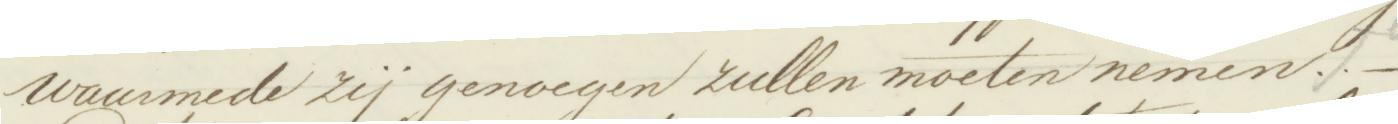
waarmede zij genoegen zullen moeten nemen..—
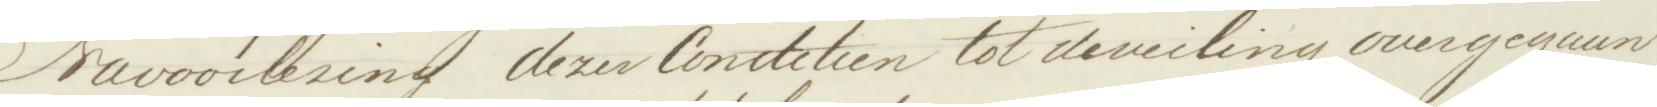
Navoorlezing dezer Conditien tot deveiling overgegaan
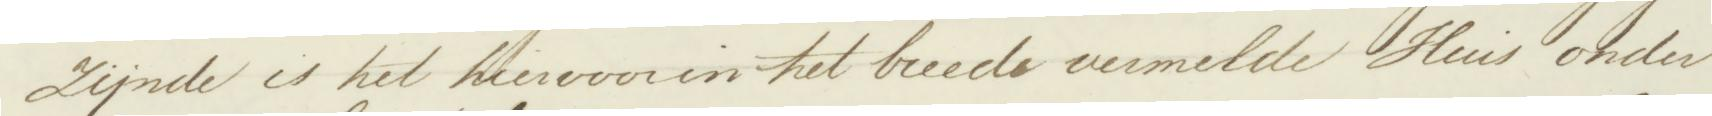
zijnde is het hiervoorin het breede vermelde Huis onder
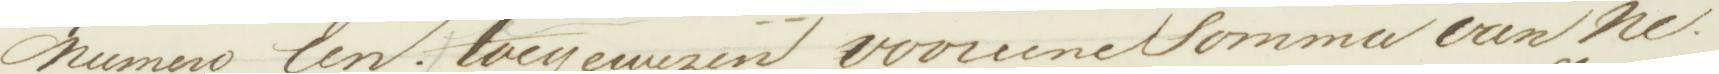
numero Een. toegewesen vooreene somma van ne.
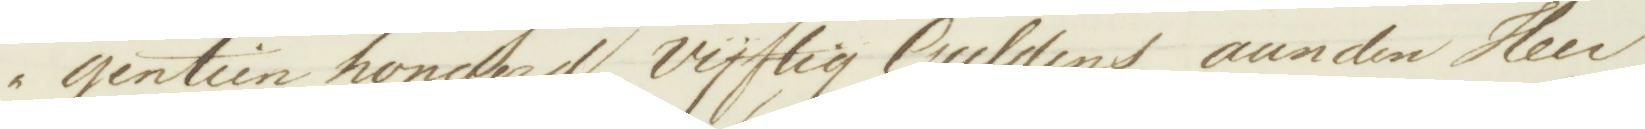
„ gentien honderd Vijftig Guldens aan den Heer
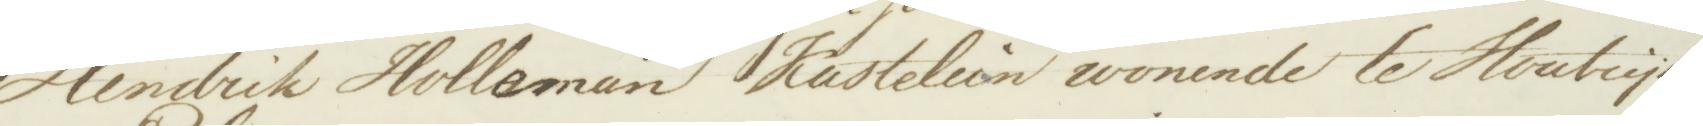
Hendrik Holleman Kastelein wonende te Houtrijk
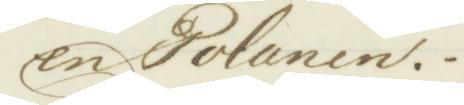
en Polanen. -
